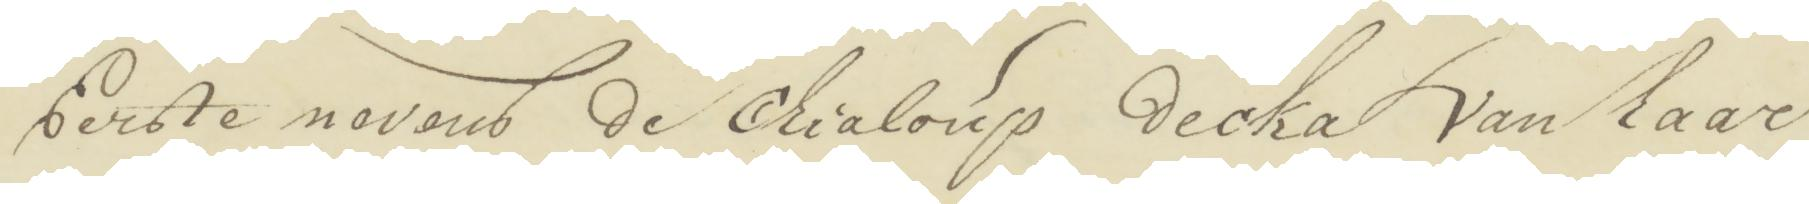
Eerste nevens de Chialoup decka van haar
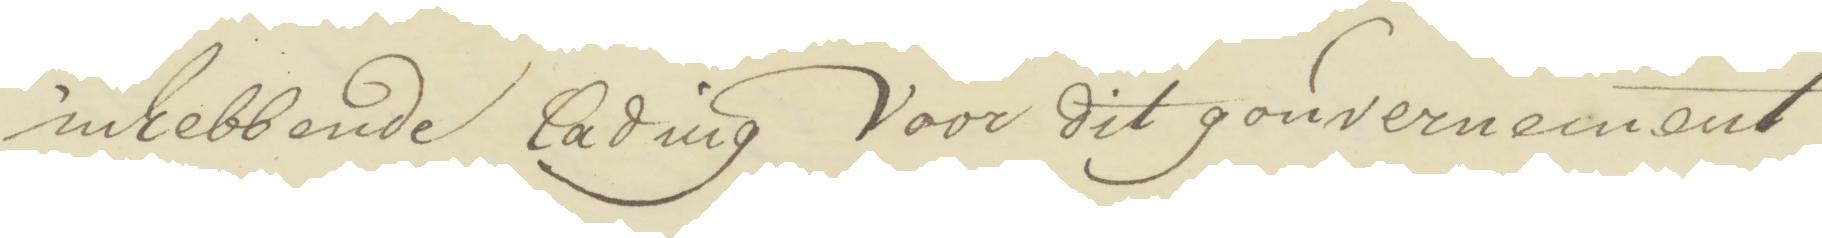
inhebbende lading voor dit gouvernement
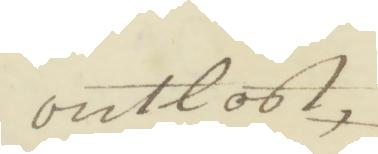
ontlost,
